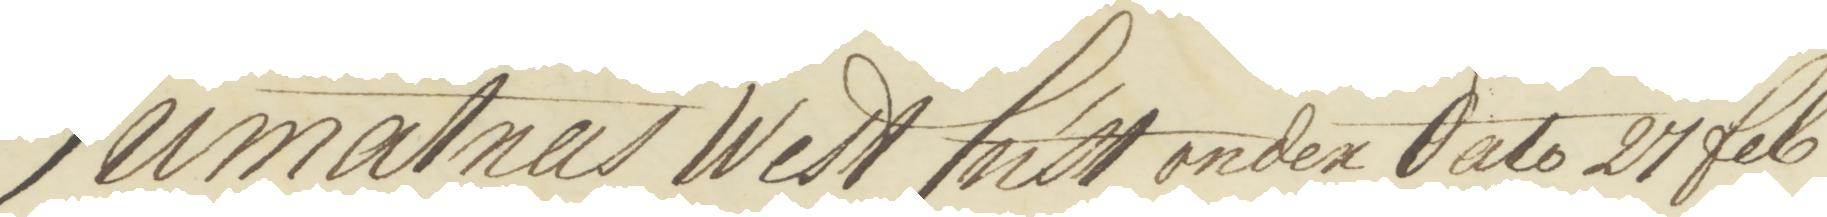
Van Sumatras west Cust onder dato 27 feb
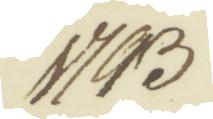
1743
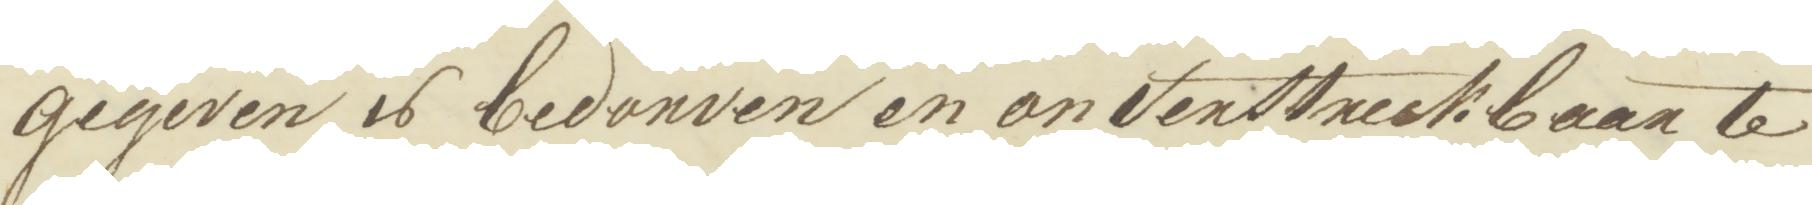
gegeven is bedorven en onverstreckbaar te
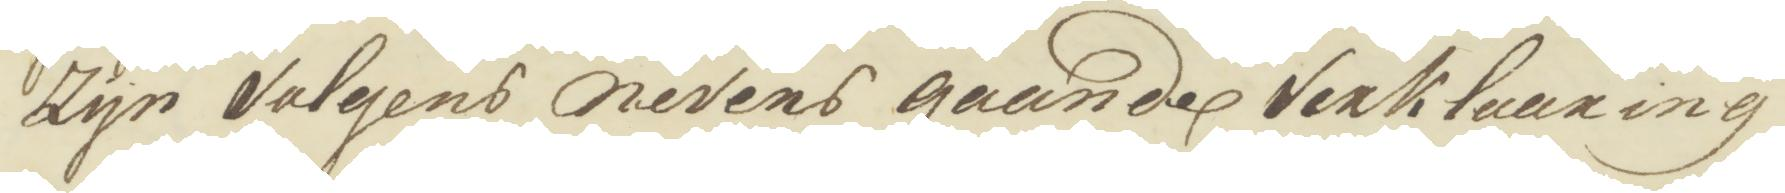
zijn volgens nevens gaande verklaaring
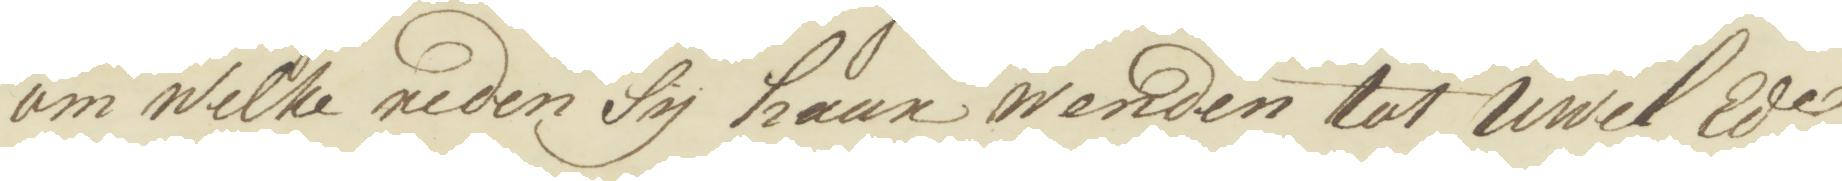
om welke reden sij haar wenden tot uwel Ed,e
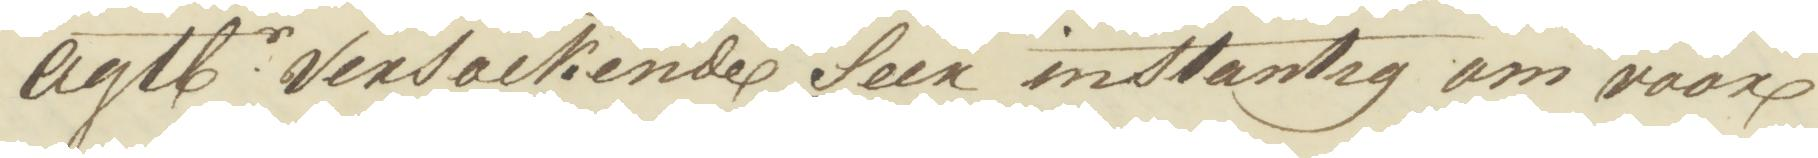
Agtb:r versoekende seer instantig om voor
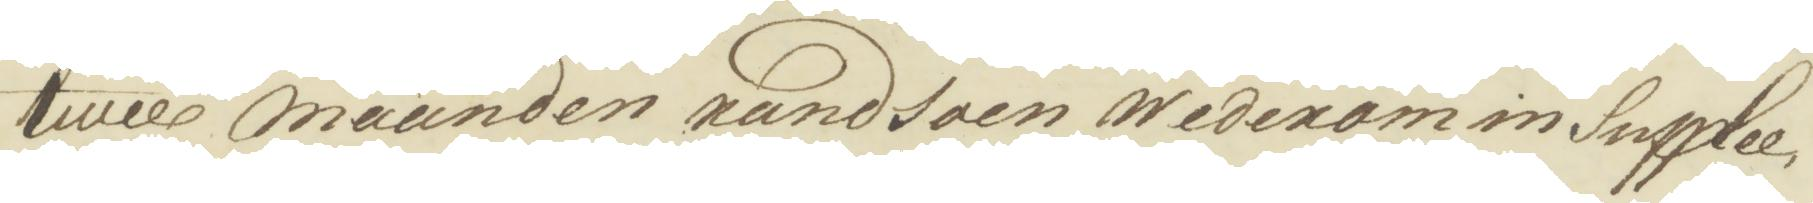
twee maanden randsoen wederom in supplee,
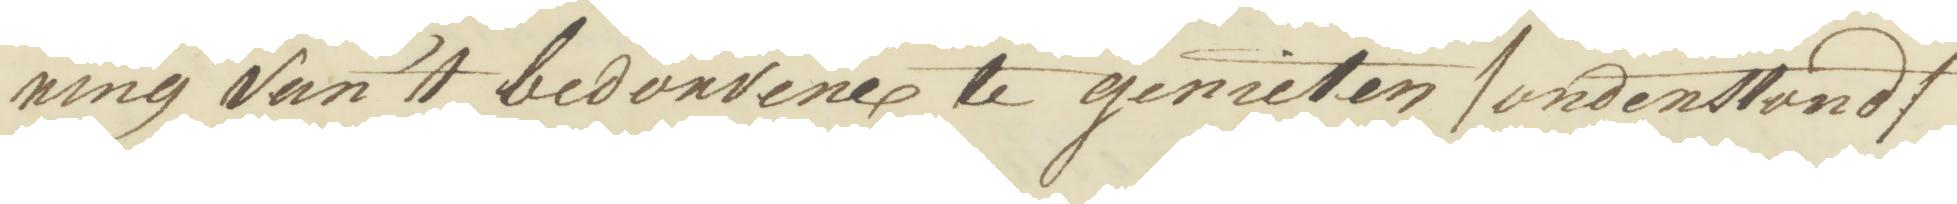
ring van ’t bedorvene te genieten /onderstond/
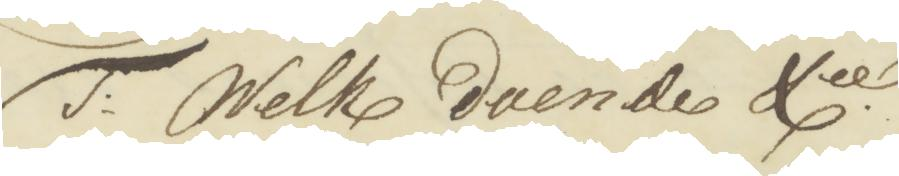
T: welk doende &c.
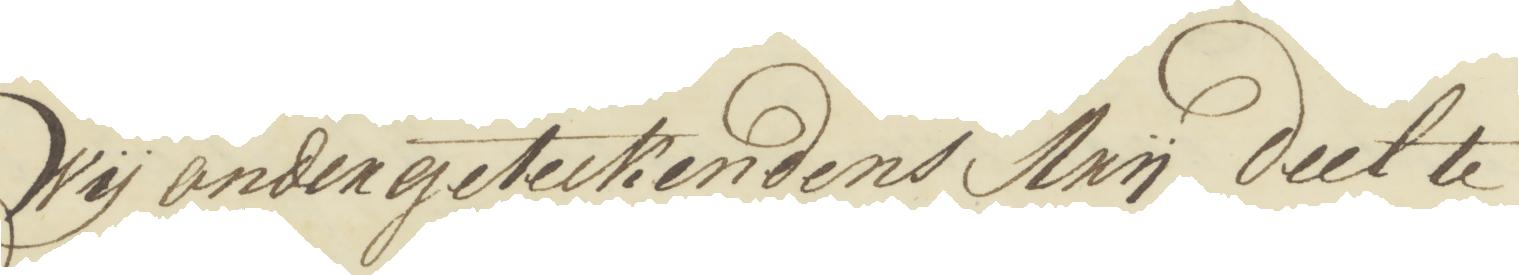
Wij ondergeteekendens Arij deel te
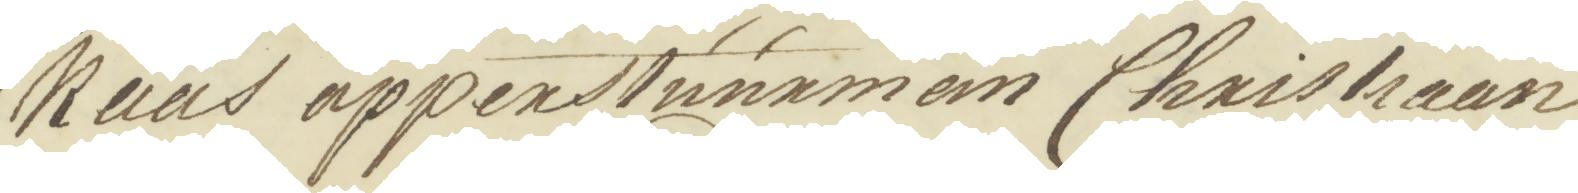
Kaas opperstuurman Christiaan
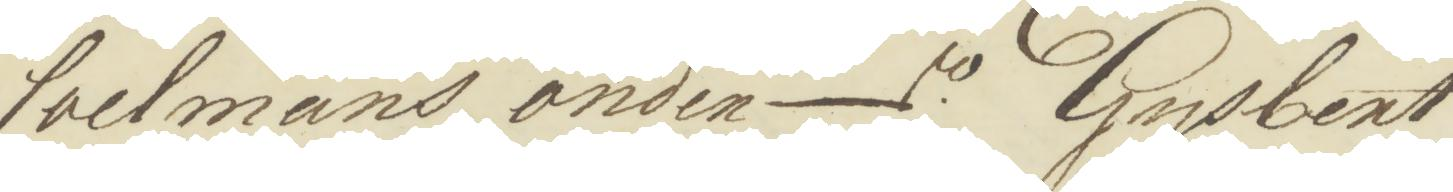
Coelmans onder _.o Gysbert
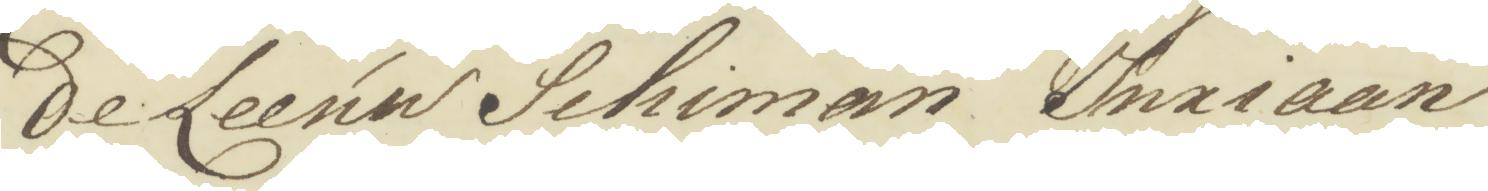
de Leeuw schiman Iuriaan
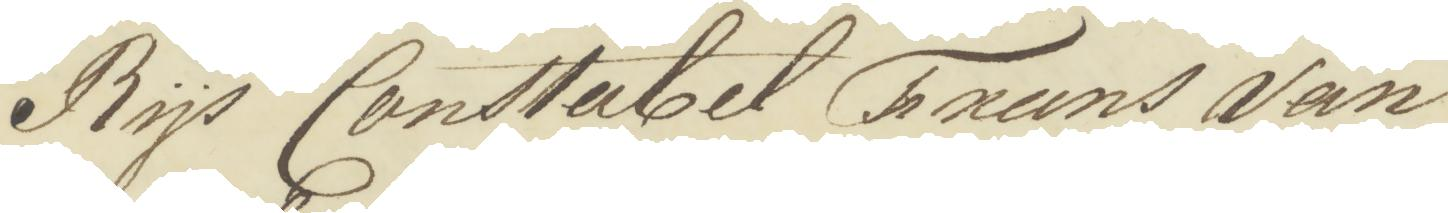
Rijs Constabel Frans van
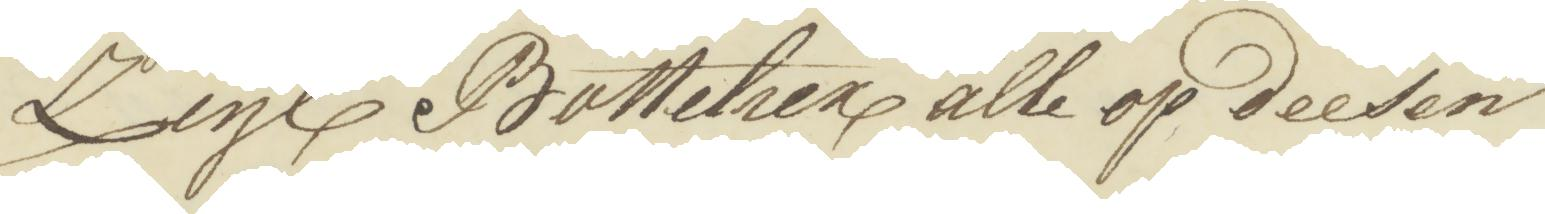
Zeijl Bottelier alle op deesen
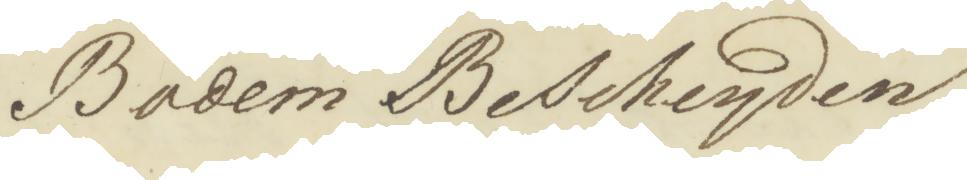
Bodem Bescheijden
